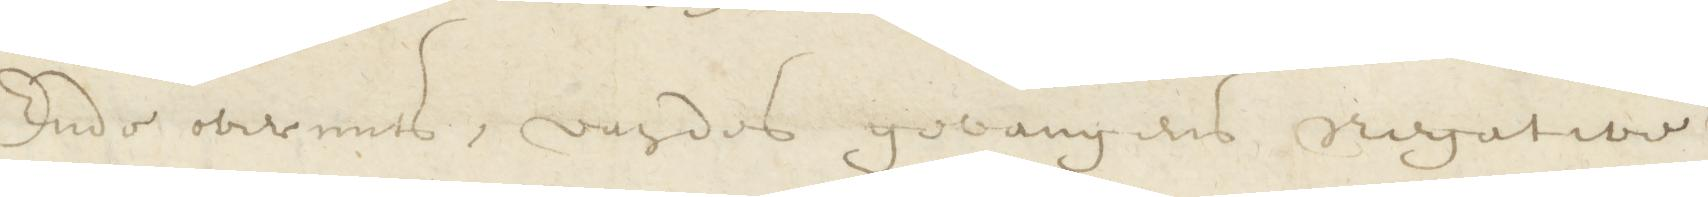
Ende overmits, vandes gevangens negative
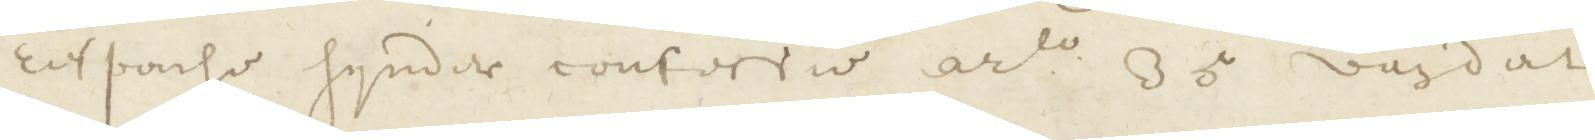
response synder confessie ar:lo 35 van dat
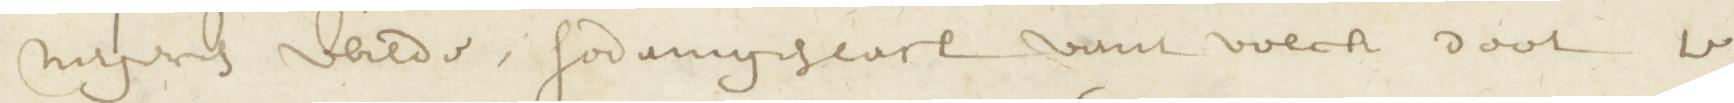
negeren wilde, sodanigen last vant welck doot te
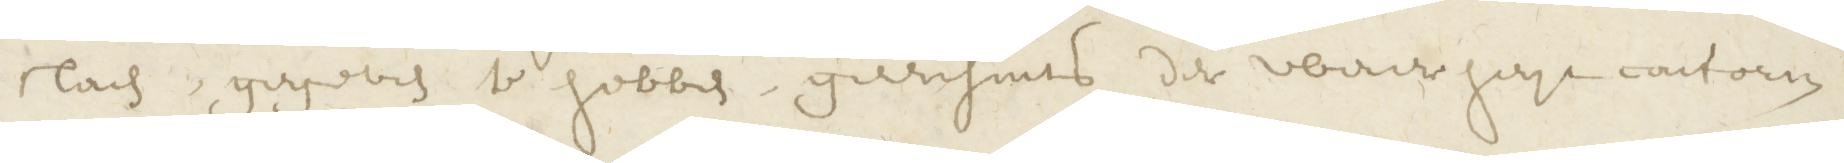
slaen, gegeven te hebben, geensints der waerheyt conform
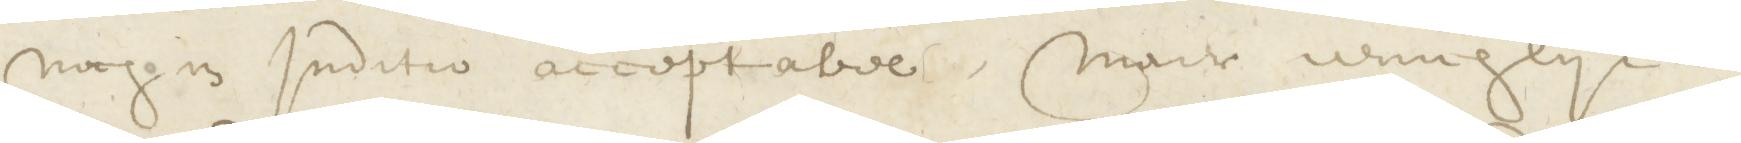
noch in juditio acceptabel, maer eenichlyck
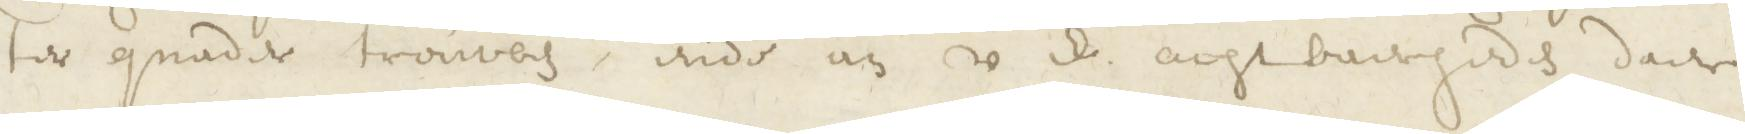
ter quader trouwen, ende an v E. achtbaerheden daer
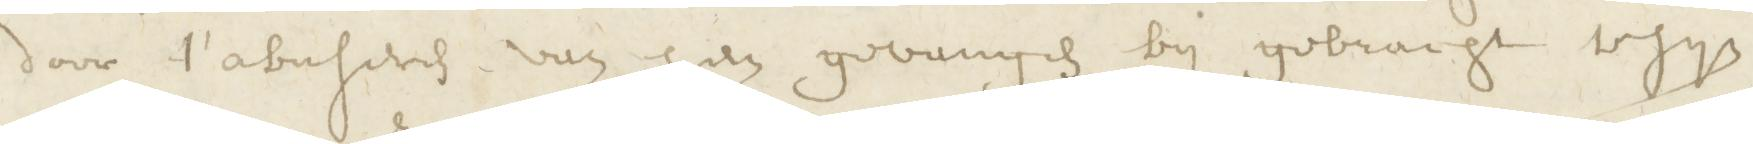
door t' abuseren van hen gevangen bij gebracht te syn
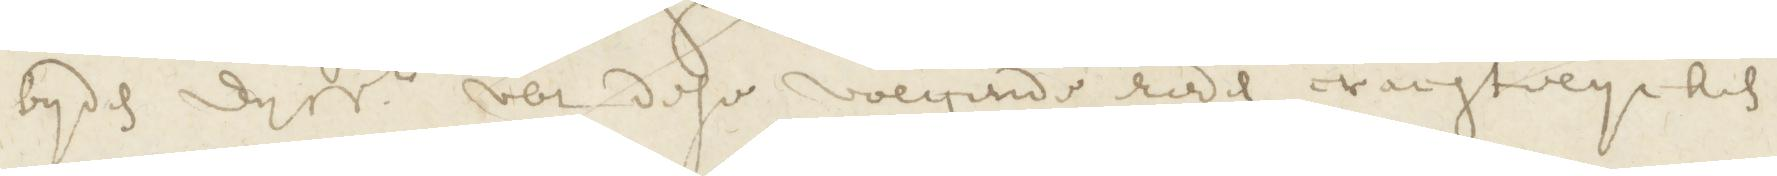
byden Eyss.r wt dese volgende reden crachtelycken
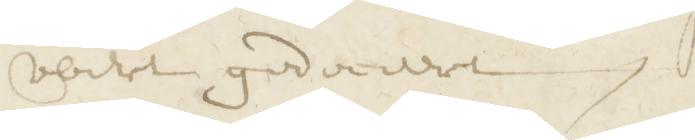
wert gedoceert
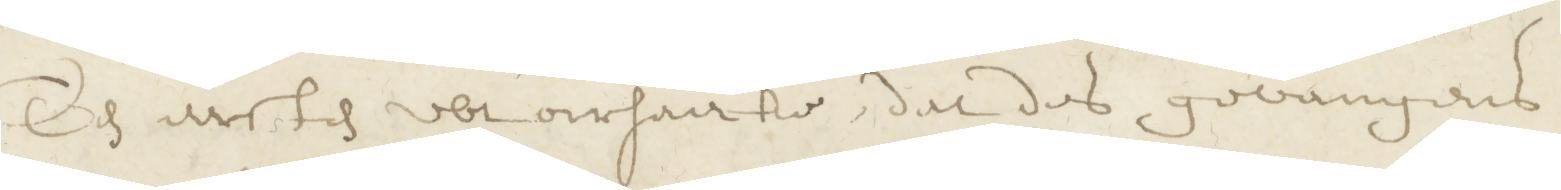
Een eersten wt oirsaecke, dat des gevangens
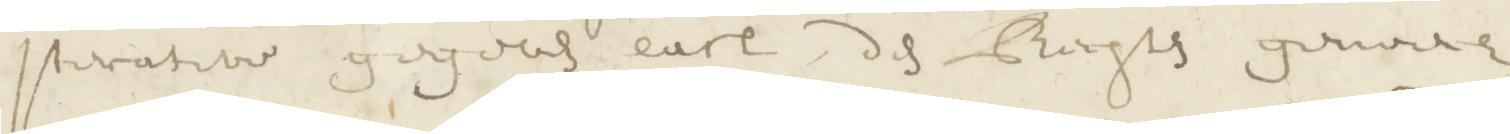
jterative gegeven erst, den Rechten genoten
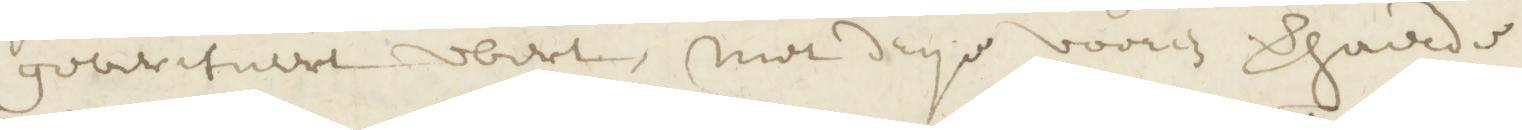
geverifieert wert, met drije vooren verhaelde
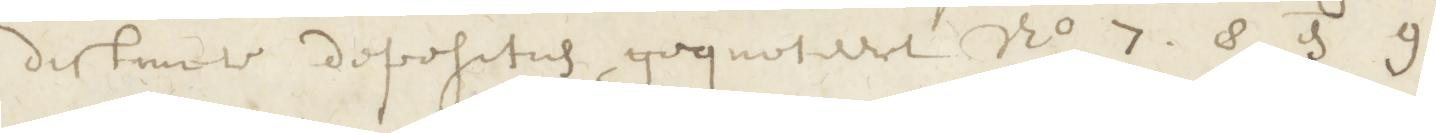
distincte depositien gequoteert No 7. 8 en 9
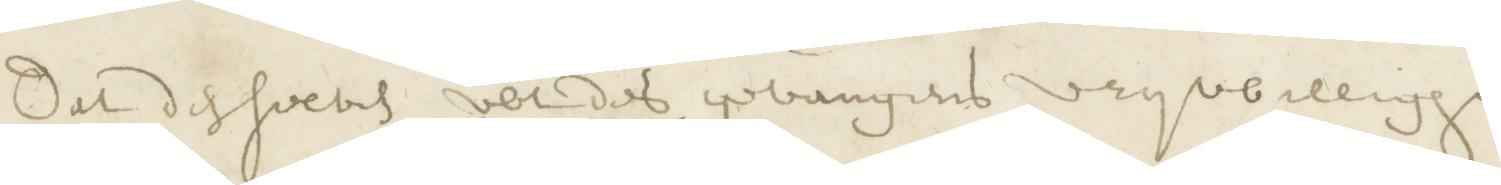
Dat denselven wt des gevangens vrywillige
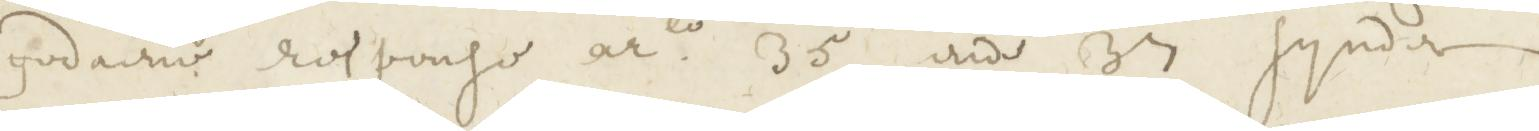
gedaene response ar.lo 35 ende 37 synder
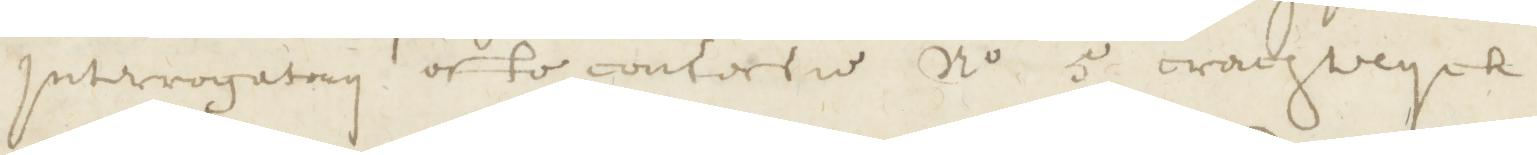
Jnterrogatory ofte confessie No 5 crachtelyck
